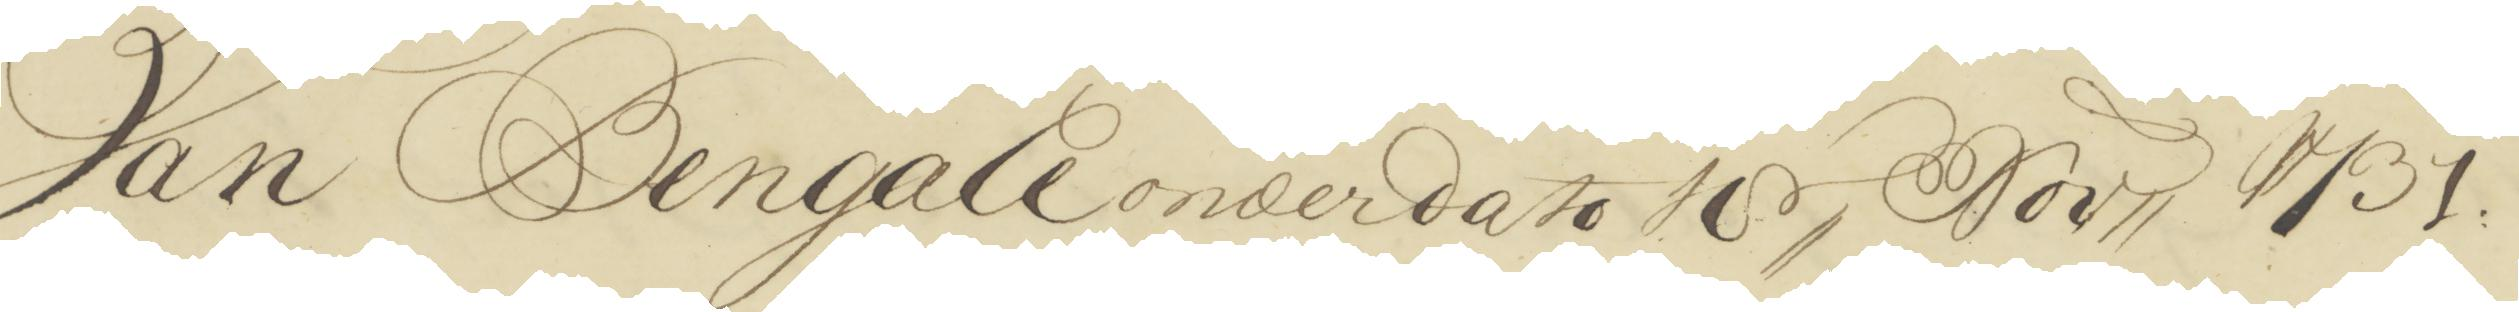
Van Bengale onder dato 18„ Nov„ 1731:
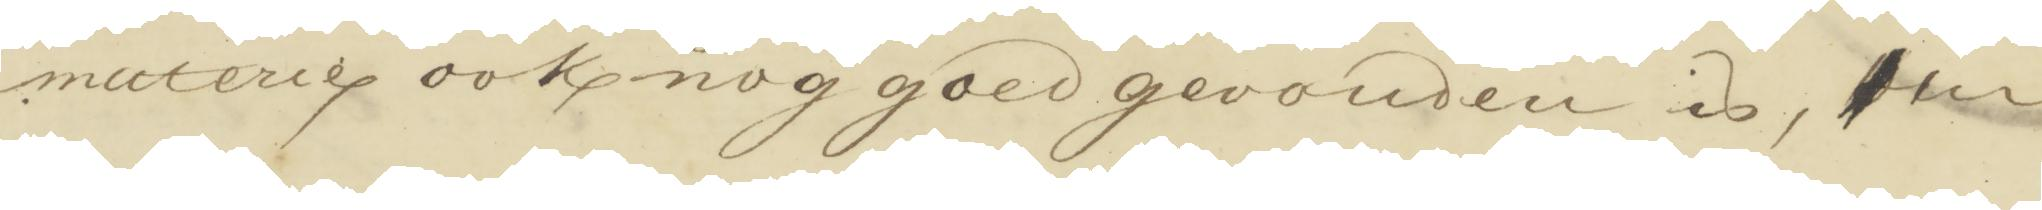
materie ook nog goed gevonden is, / in
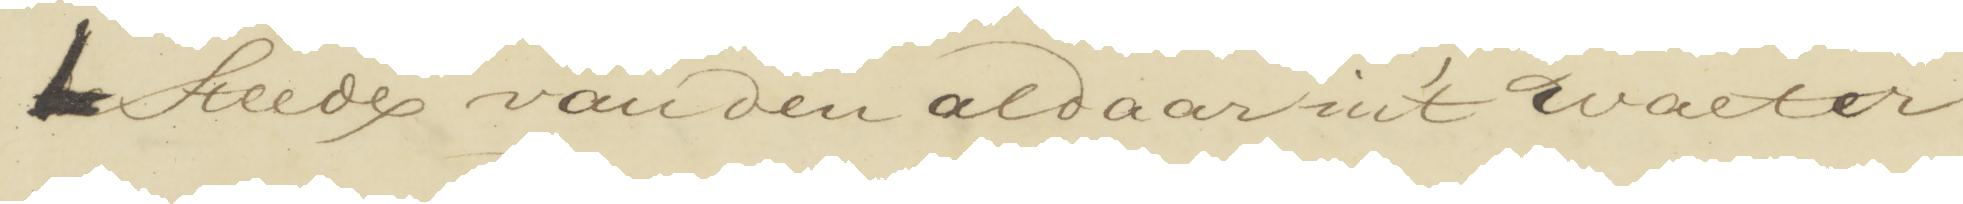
/ steede van den aldaar in't waeter
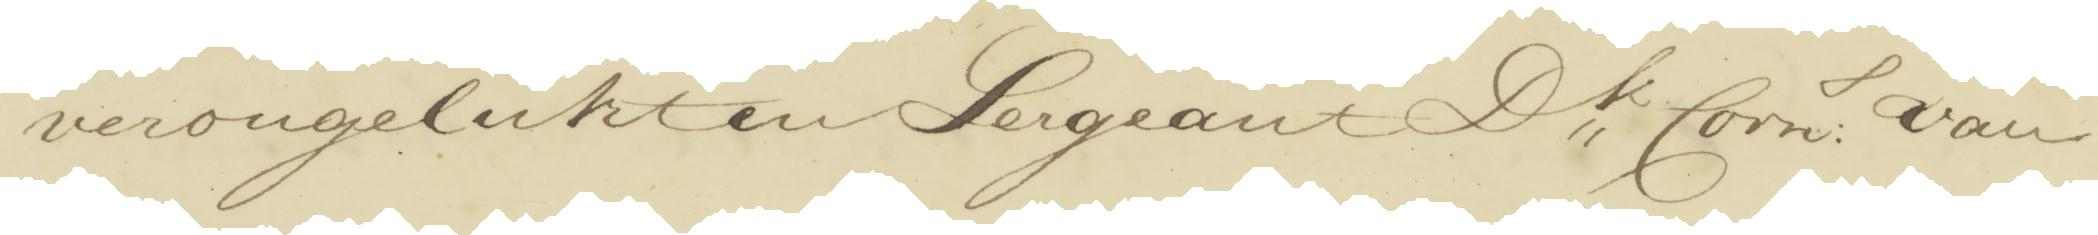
verongelukten Sergeant D„k Corn:s van
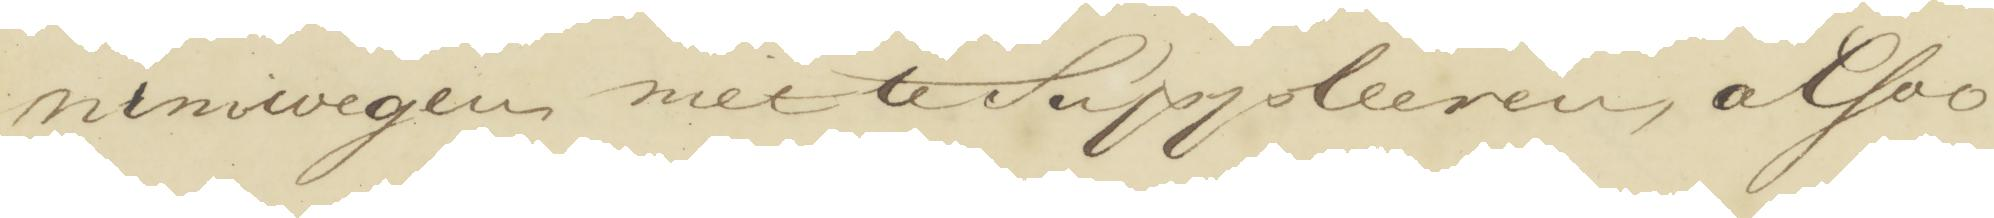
nimwegen niet te suppleeren, alsoo
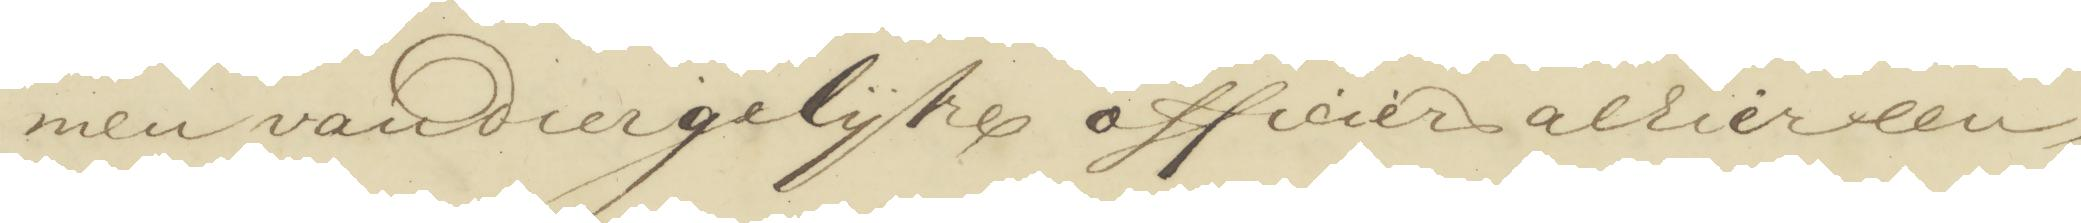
men van diergelijke officier alhier een
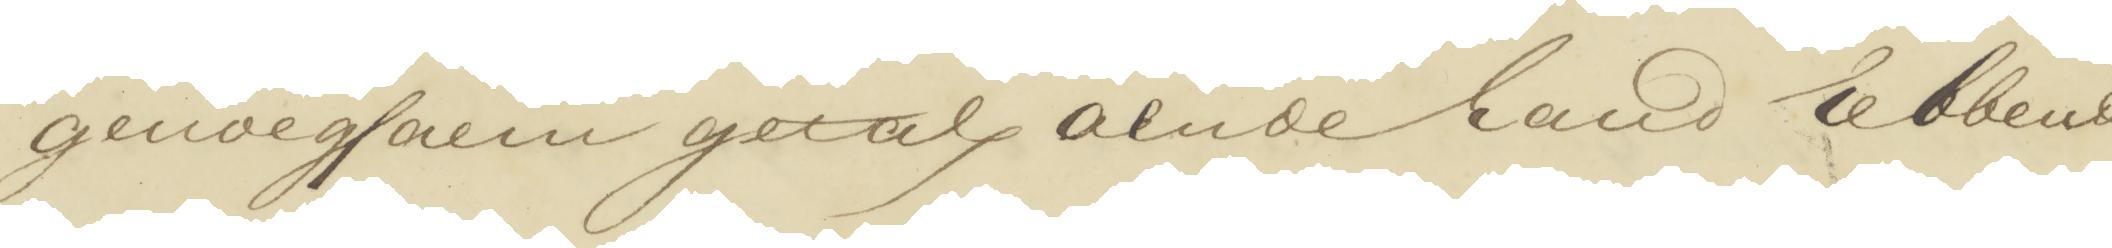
genoegsaem getal aen de hand hebbende
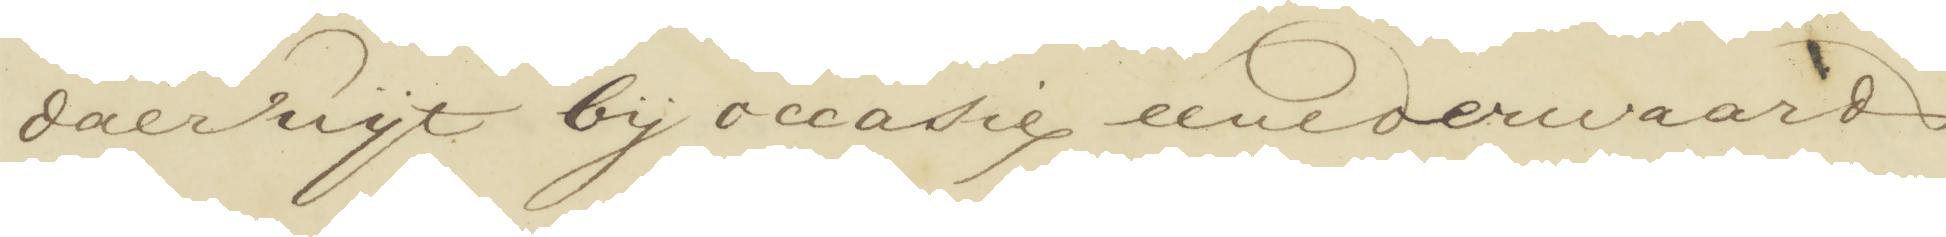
daer uijt bij occasie eene derwaard
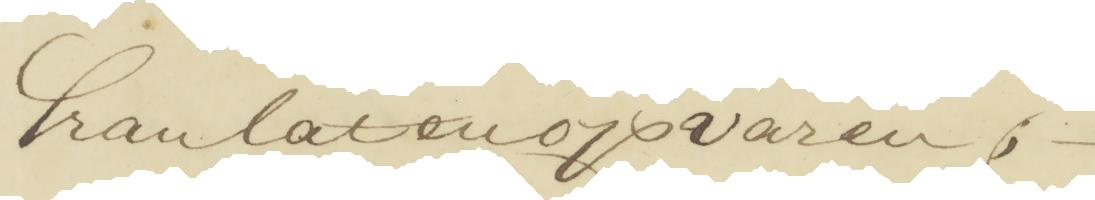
kan laten opvaren
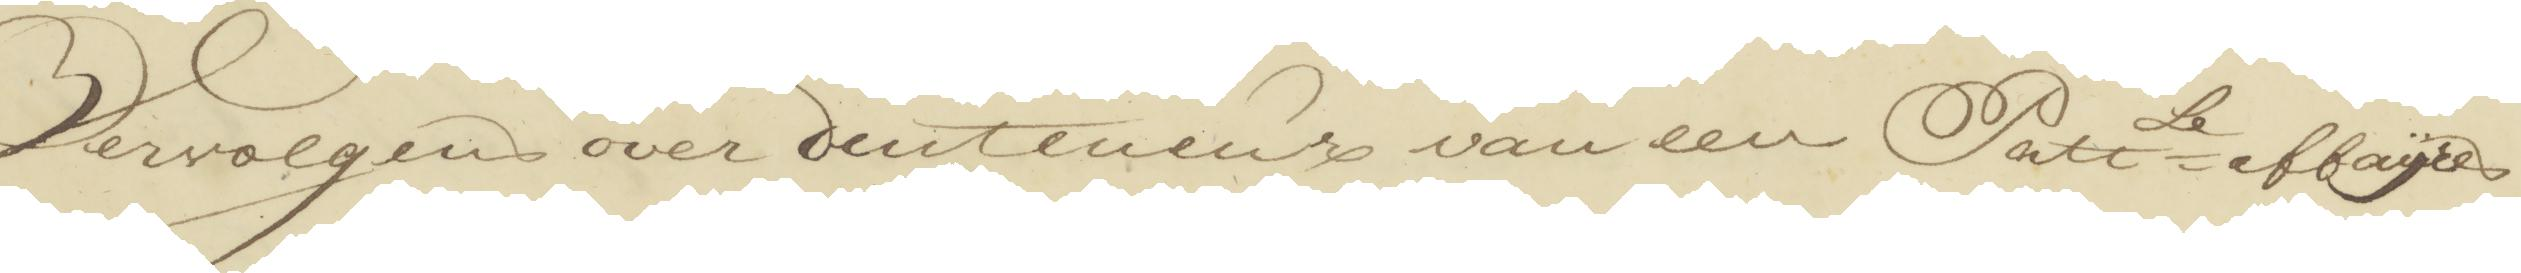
Vervolgens over den teneur van een Patt=se affaijre
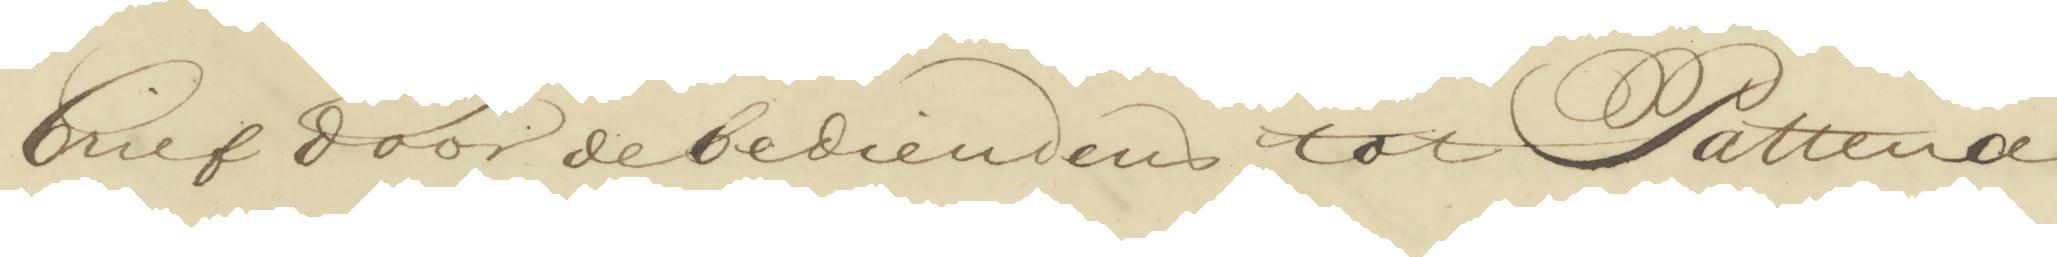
brief door de bedienden tot Pattenoe
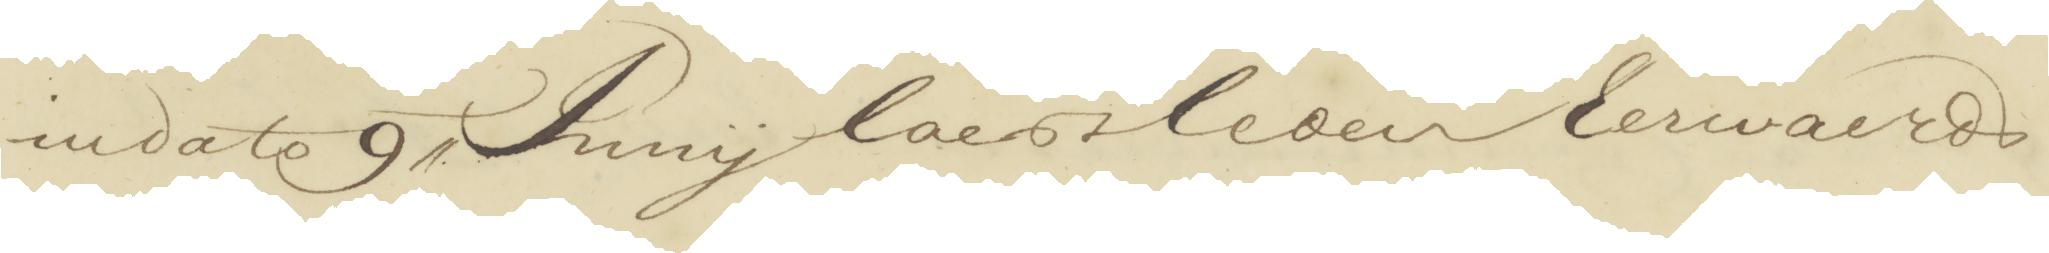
in dato 9„ Junij laestleden herwaerds
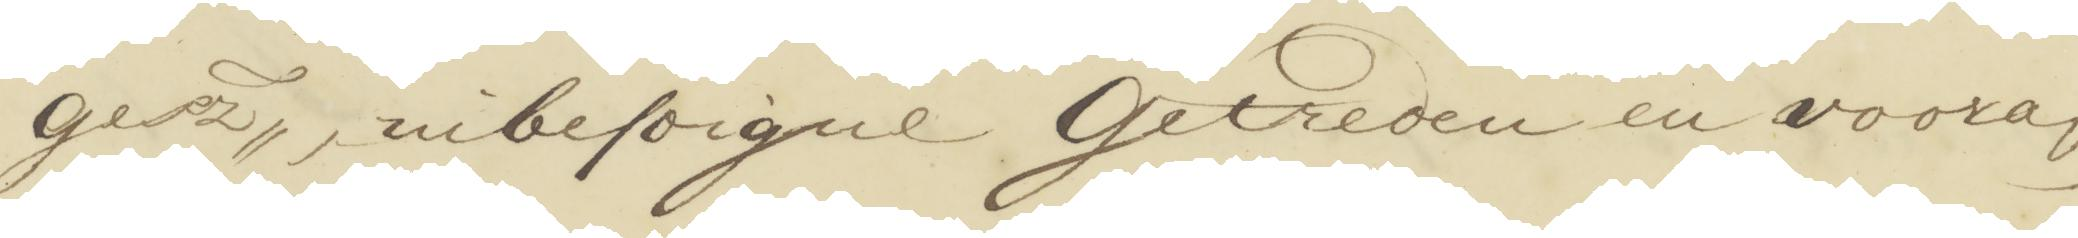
gesz„, in besoigne getreden en vooraf
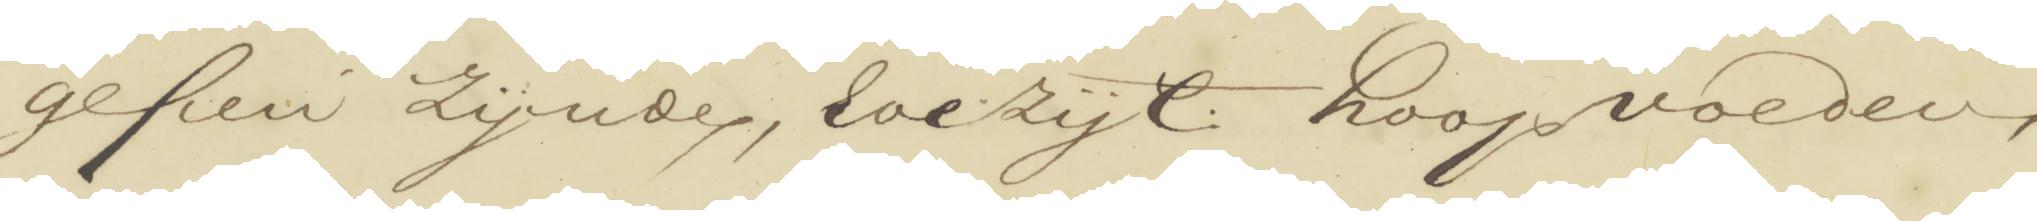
gesien zijnde, hoe zijl: hoop voeden,
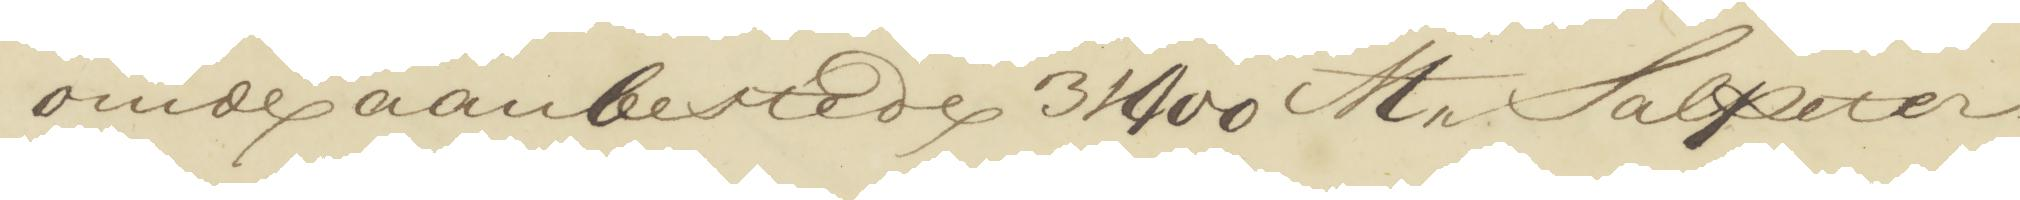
om de aanbestede 31400 M„ Salpeter
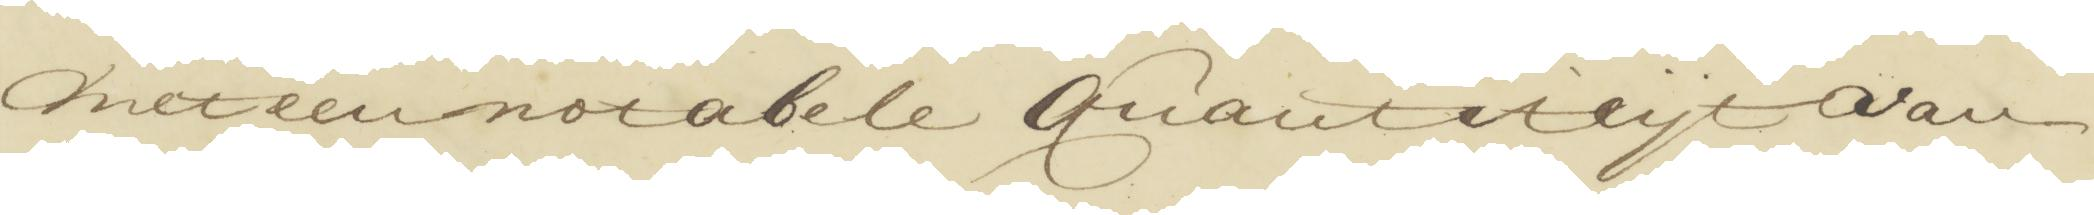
met een notabele quantiteijt van
